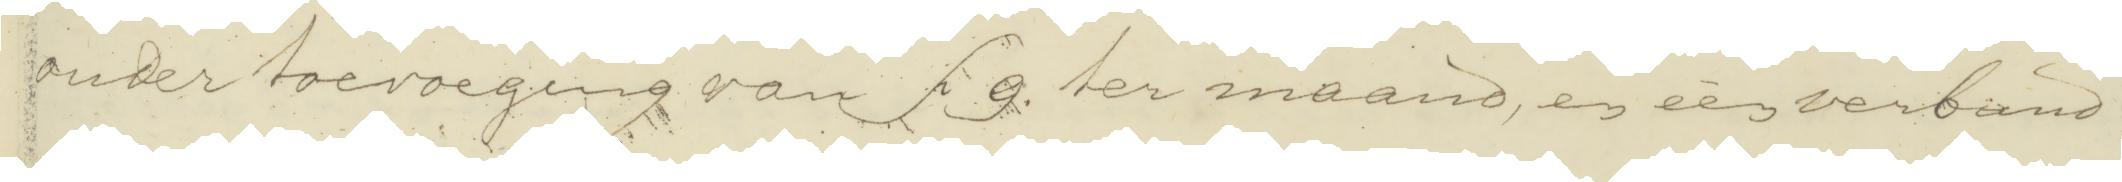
onder toevoeging van ƒ 9. ter maand, en een verband
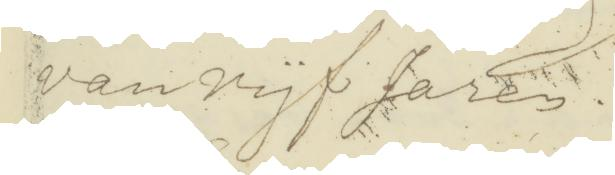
van vijf Jaren. —
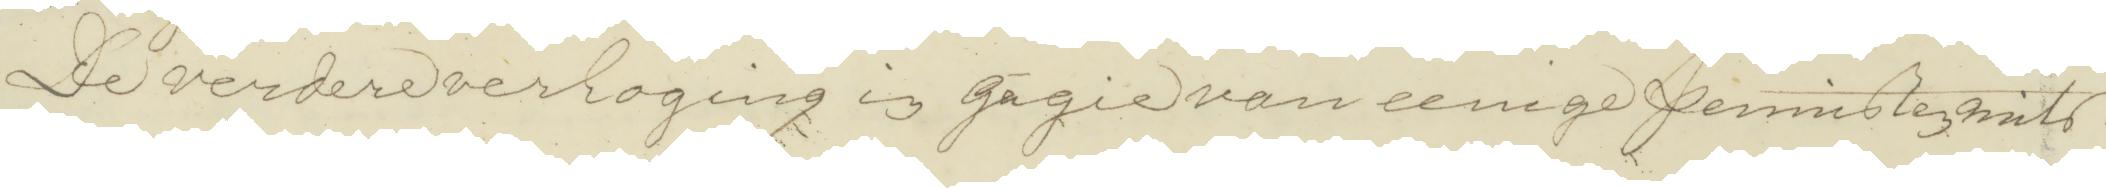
De verdere verhoging in gagie van eenige pennisten mits
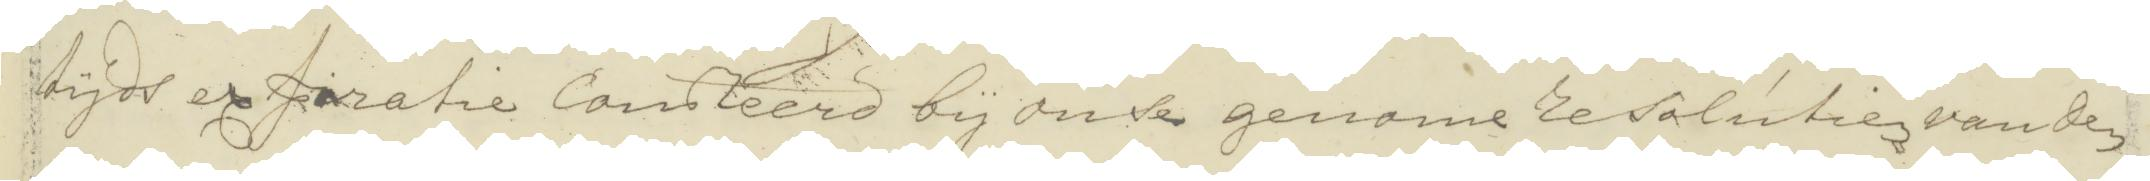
tijds expiratie consteerd bij onse genome resolutien van den
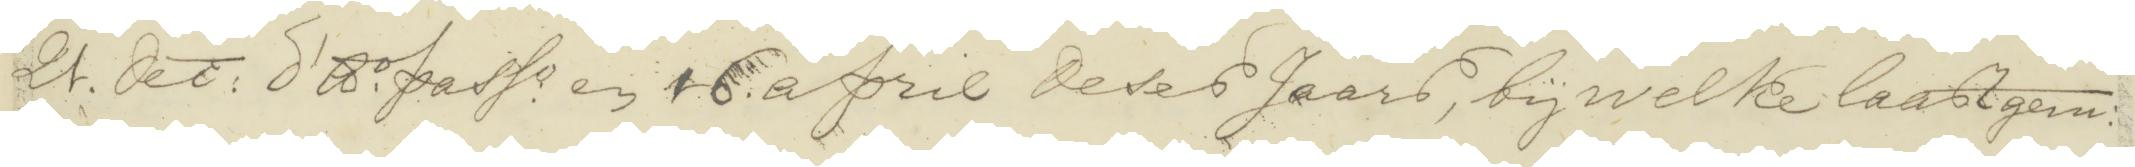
21. dec: d’ A:o pass:o en 16. april deses Jaars, bij welke laastgem:
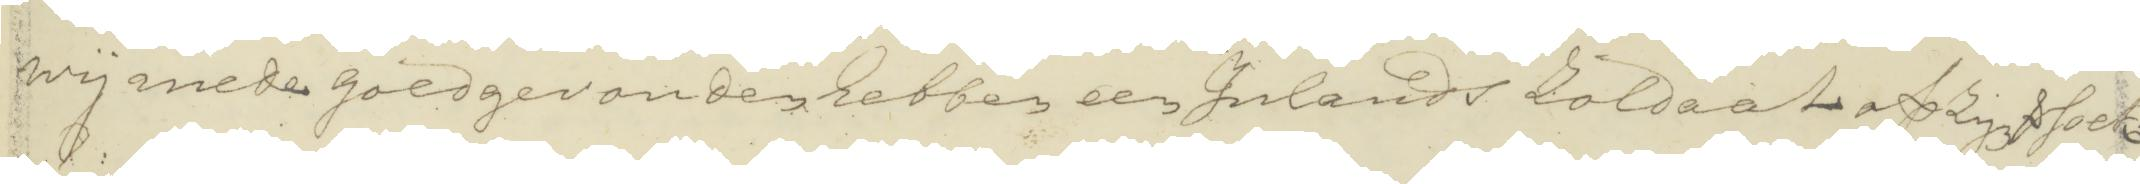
wij mede goedgevonden hebben een Inlands Zoldaat op zijn versoek
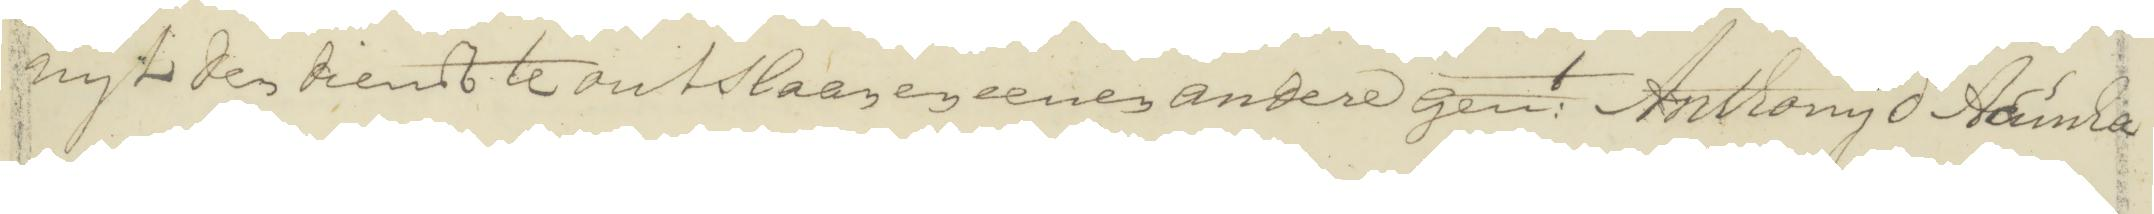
uijt den dienst te ontslaan en eenen andere gen:t Anthonij d' Acunha
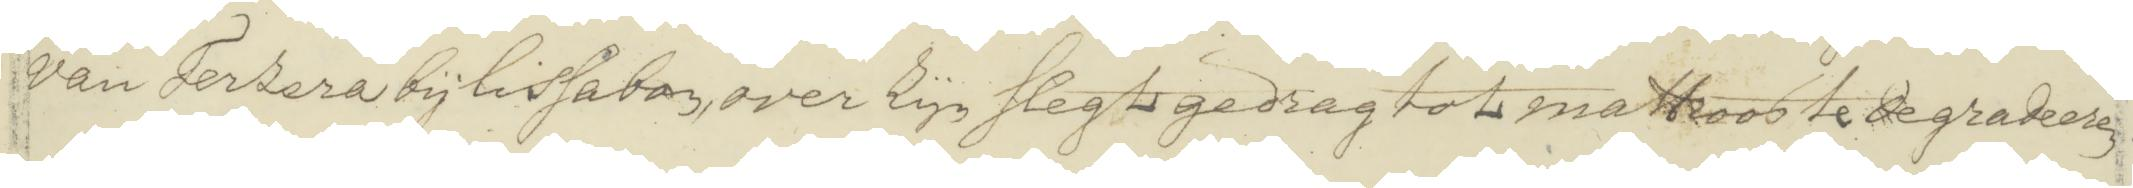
van Terzera bij lissabon, over Zijn slegt gedrag tot mattroos te degradeeren.
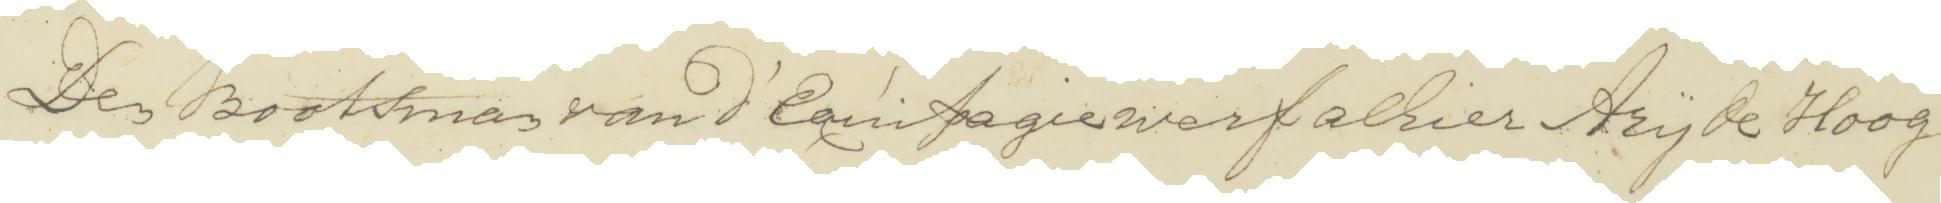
Den Bootsman van d’ Equipagie werf alhier Arij de Hoog
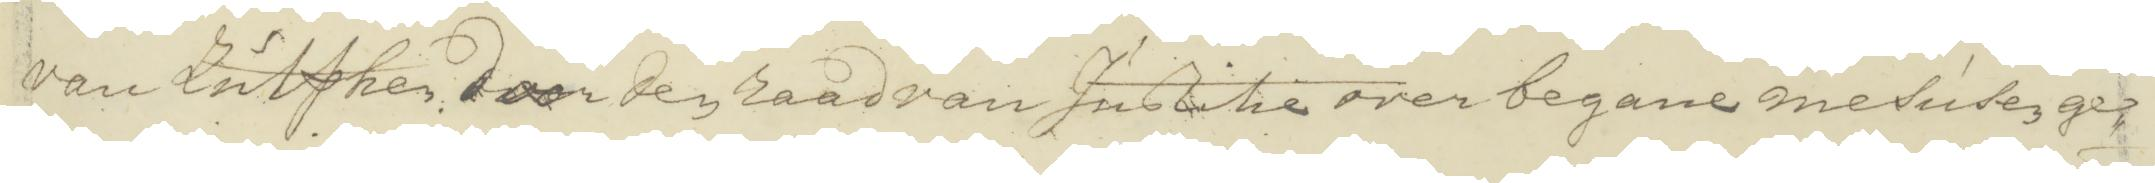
van Zutphen door den raad van Justitie over begane mesusen ge„
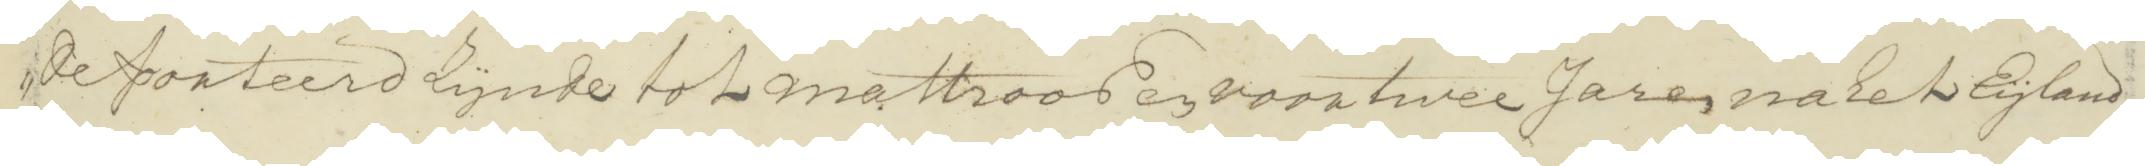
„deporteerd Zijnde tot mattroos en voor twee Jare na het Eijland
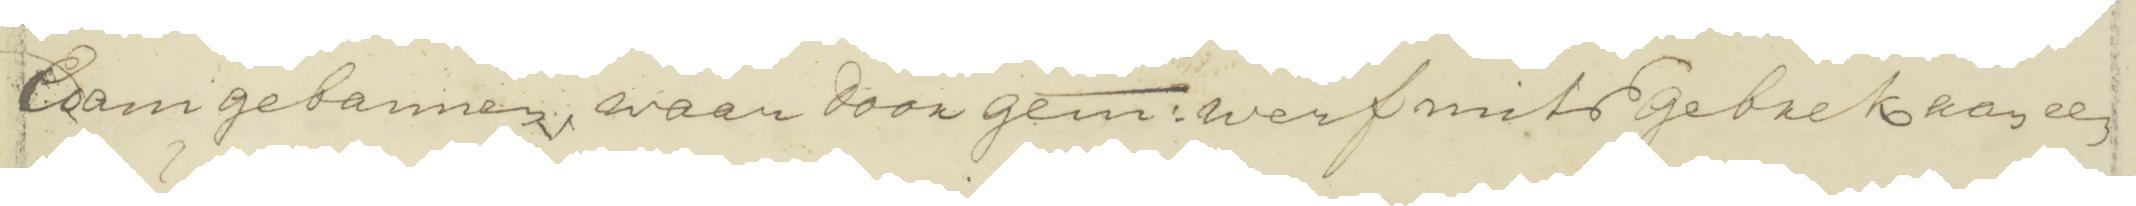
Edam gebannen, waar door gem: werf mits gebrek aan een
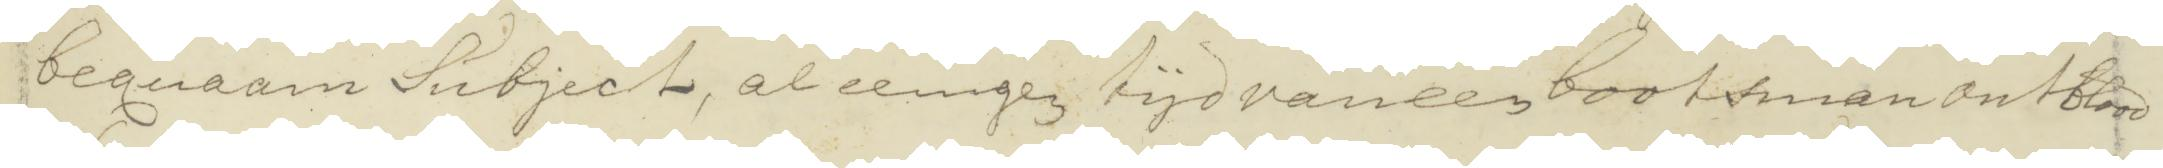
bequaam subject, al eenigen tijd van een bootsman ontblood
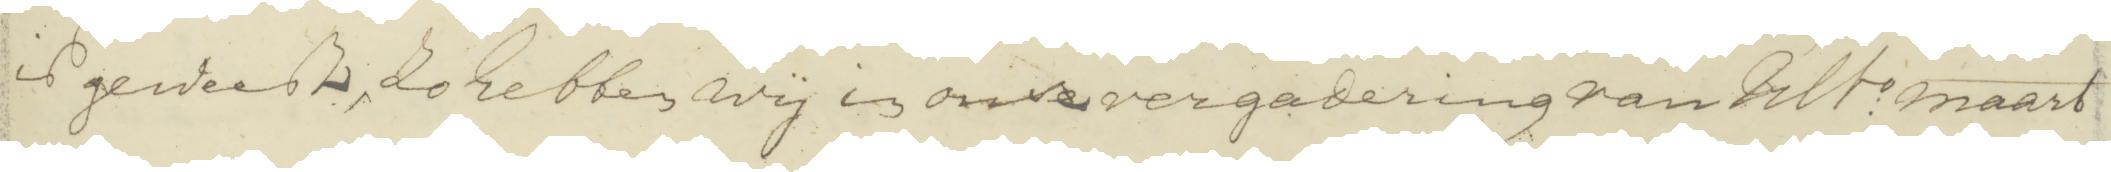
is geweest, Zo hebben wij in onse vergadering van Ult:o maart
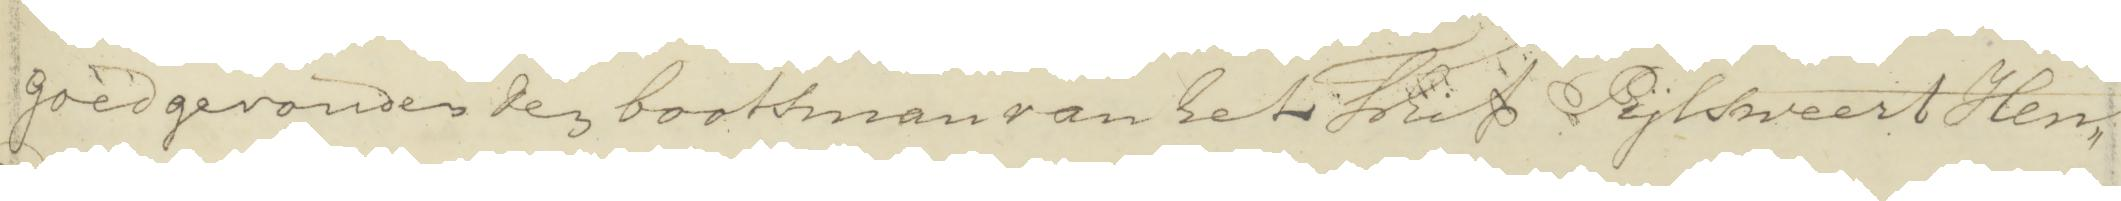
goed gevonden den bootsman van het schip Pijlsweert Hen„
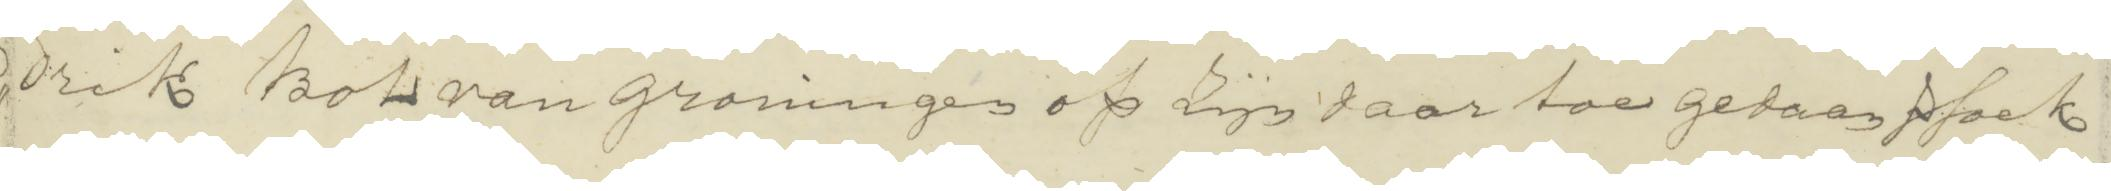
„drik Bot van Groningen op zijn daar toe gedaan versoek
